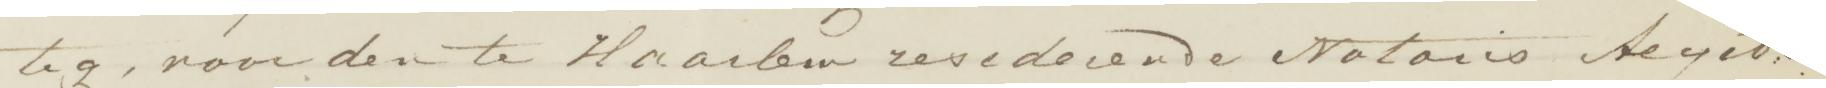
tig, voor den te Haarlem residerende Notaris Aegidi
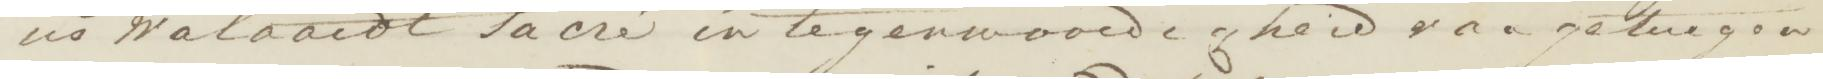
us Walaardt sacré in tegenwoordigheid van getuigen
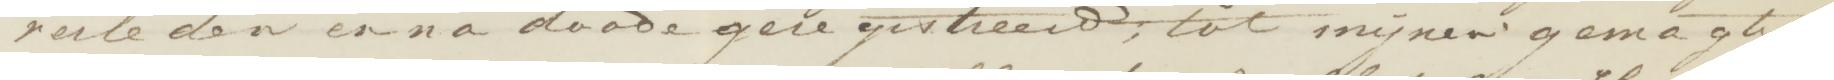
verleden en na doode geregistreerd; tot mijnen gemagtig
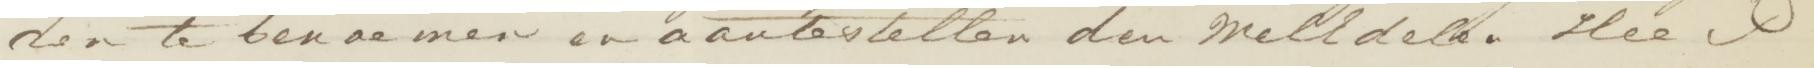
den te benoemen en aantestellen den welEdele Hee P
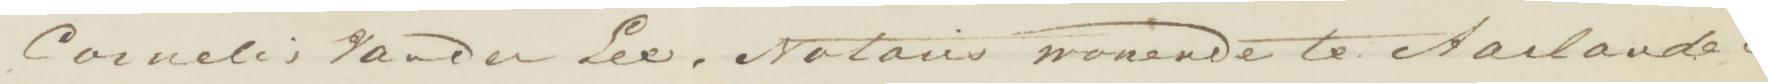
Cornelis vander Lee, Notaris wonende te Aarlander
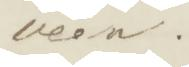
veen.
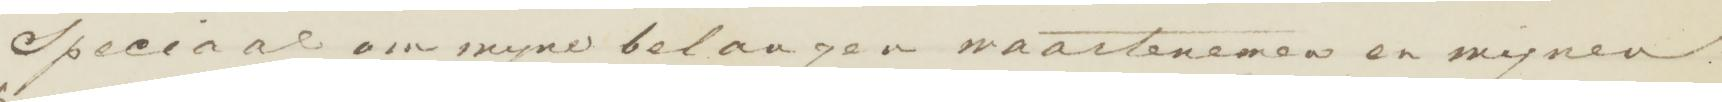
Speciaal om myne belangen waartenemen en mijnen
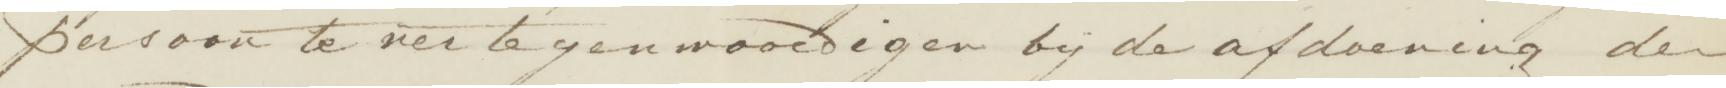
Persoon te vertegenwoordigen bij de afdoening der
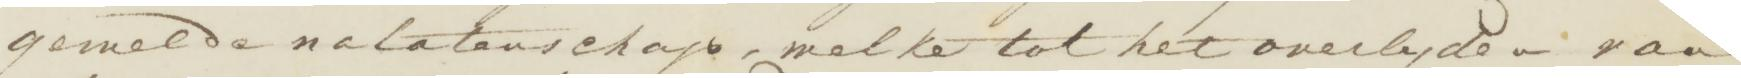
gemelde nalatenschap, welke tot het overlyden van
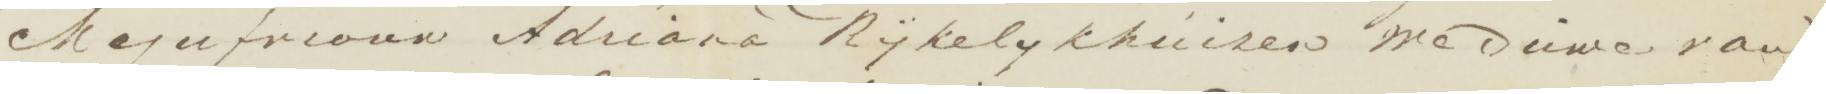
Mejufvrouw Adriane Rijkelykhuizen weduwe van
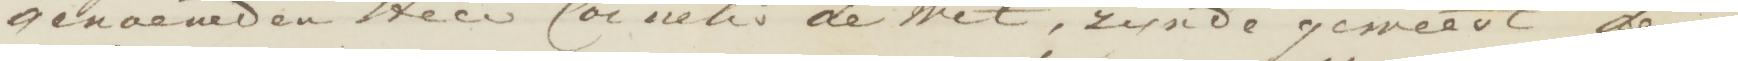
genoemden Heer Cornelis de wit, zynde geweest den
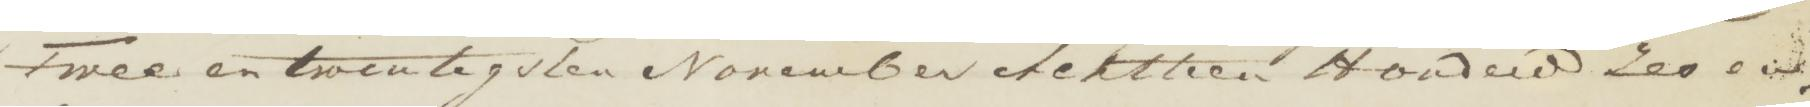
Twee en twintigsten November Achttien Honderd Zes en
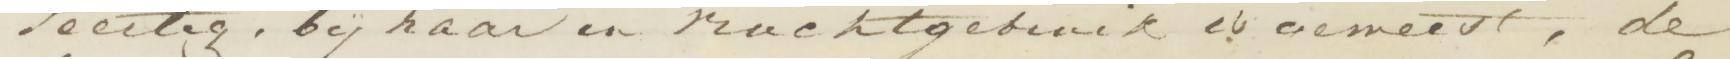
Veertig, bij haar in vruchtgebruik is geweest, de
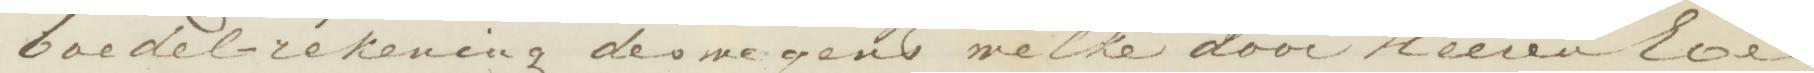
boedel-rekening deswegens welke door Heeren Exe
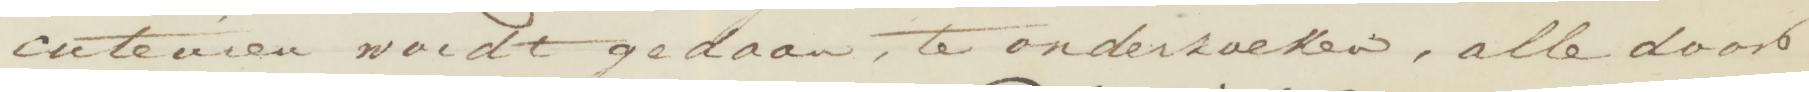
cuteuren wordt gedaan, te onderzoeken, alle door
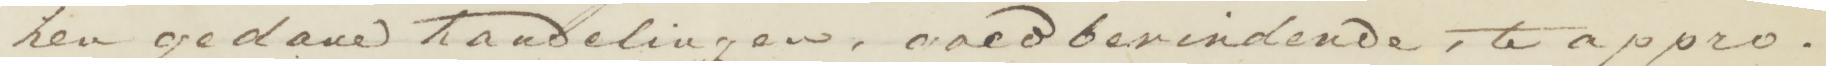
hen gedane handelingen, goed bevindende, te appro.
